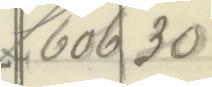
ƒ 606 30
